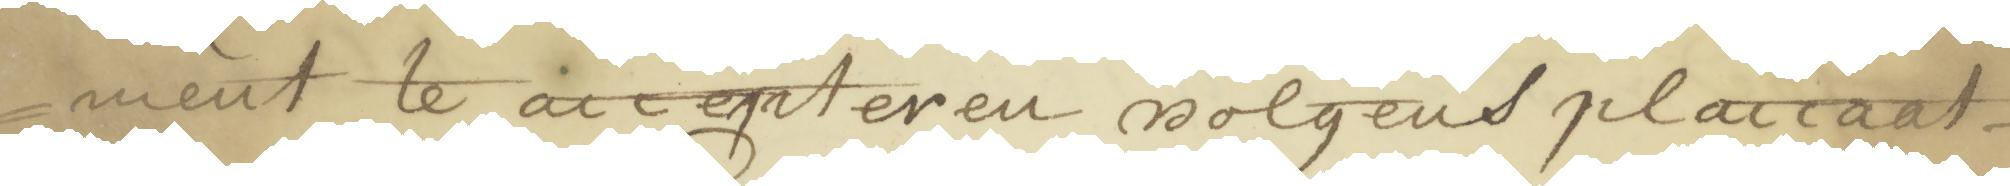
=ment te accepteren volgens placcaat
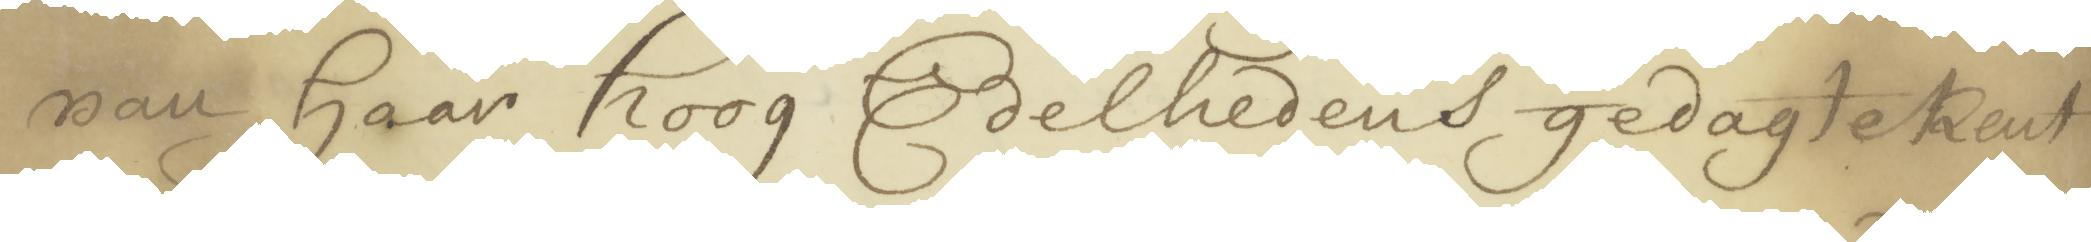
van haar hoog Edelhedens gedagtekent
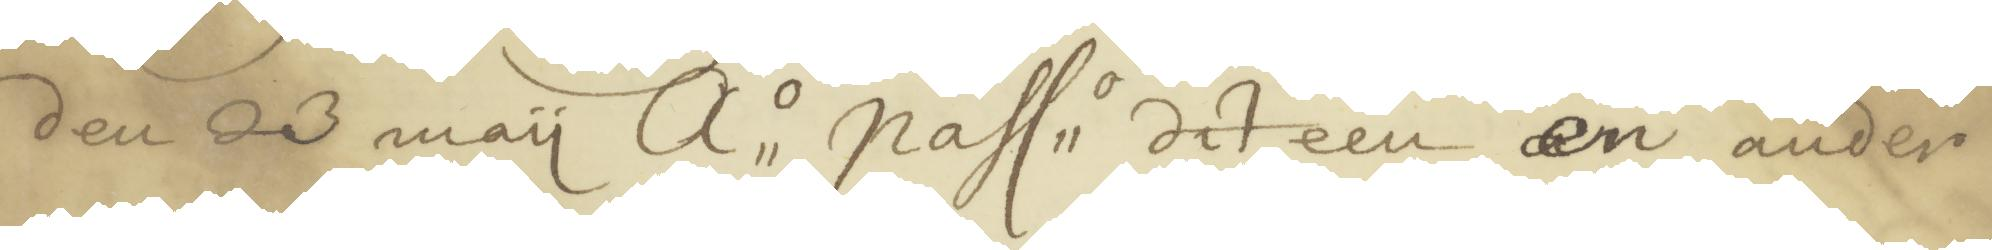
den 23 maij A„o pass„o dit een en ander
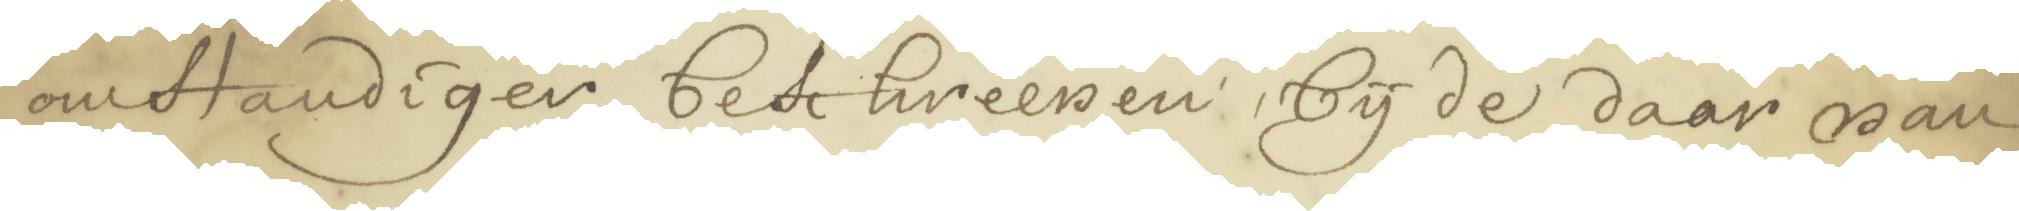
omstandiger beschreeven, bij de daar van
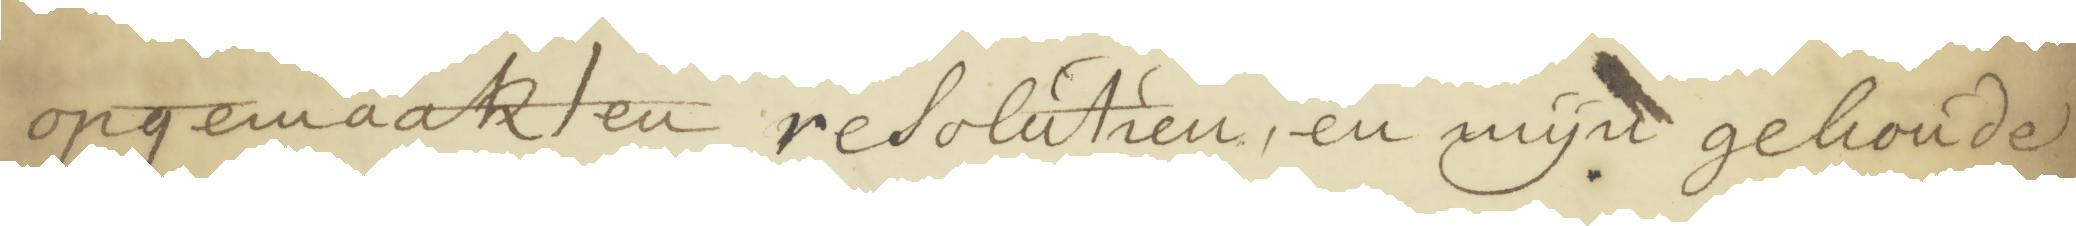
opgemaakten resolutien, en mijn gehoude
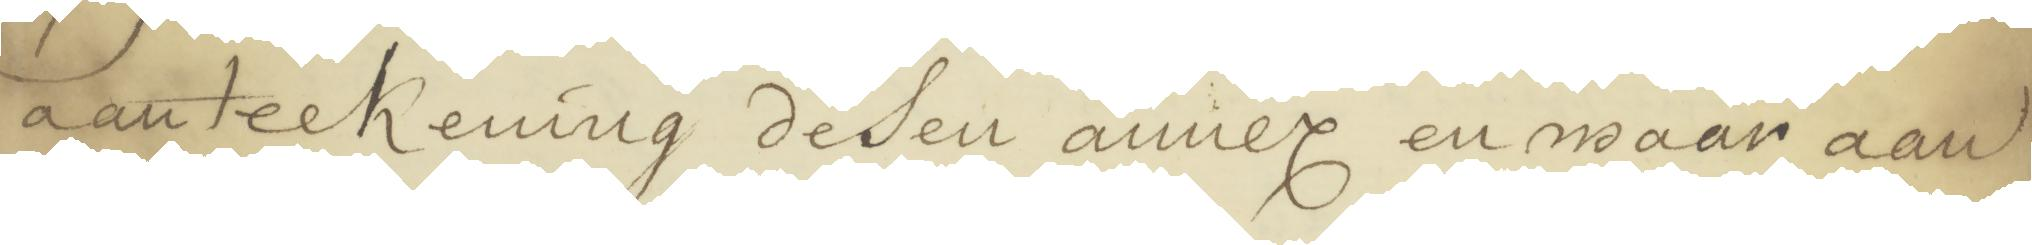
aanteekening desen annex en waar aan
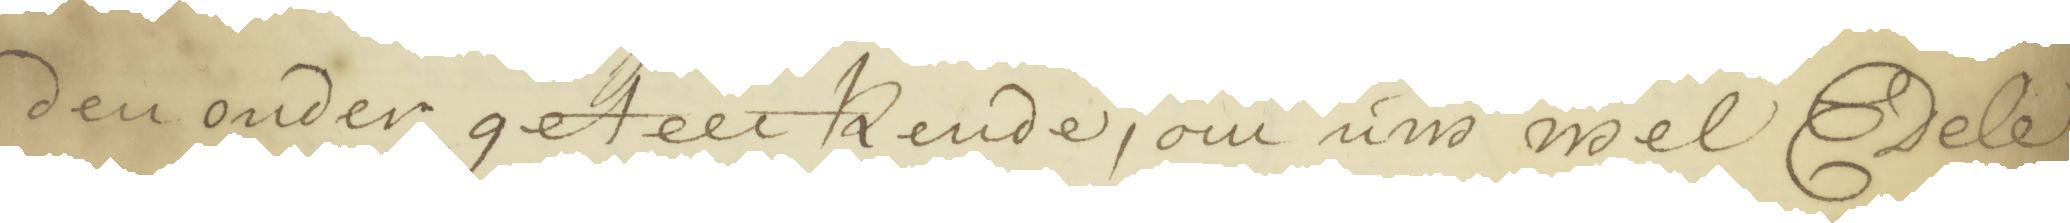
den onder geteeckende, om uw wel Edele
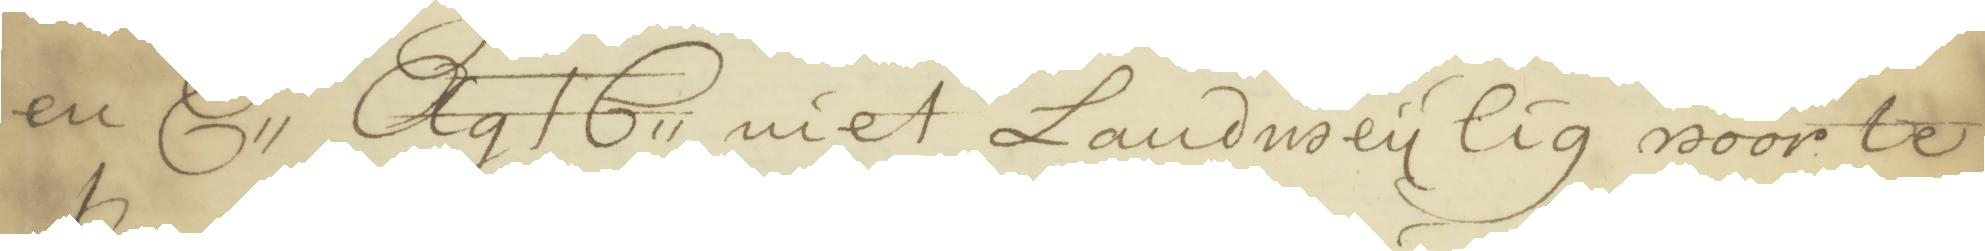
en E„ Agtb„ niet Landweijlig voor te
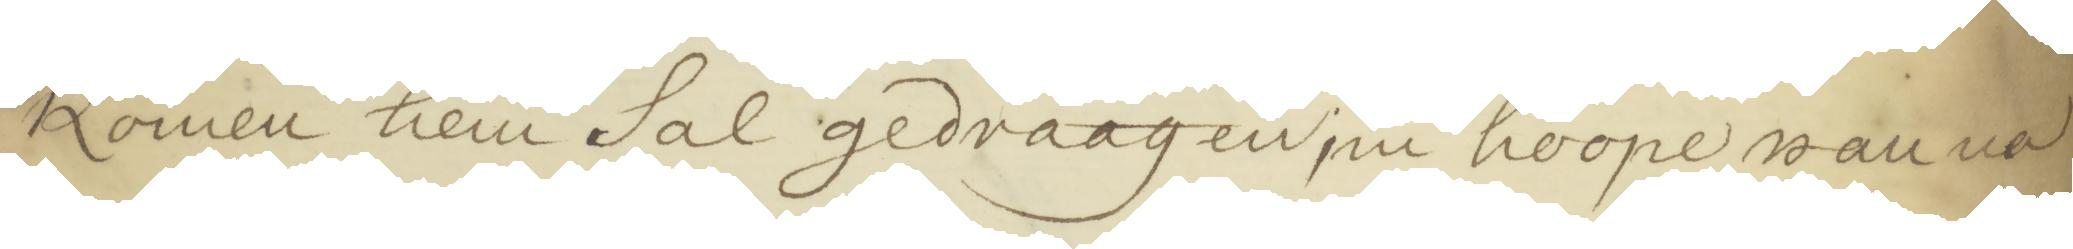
komen hem sal gedraagen, in hoope van na
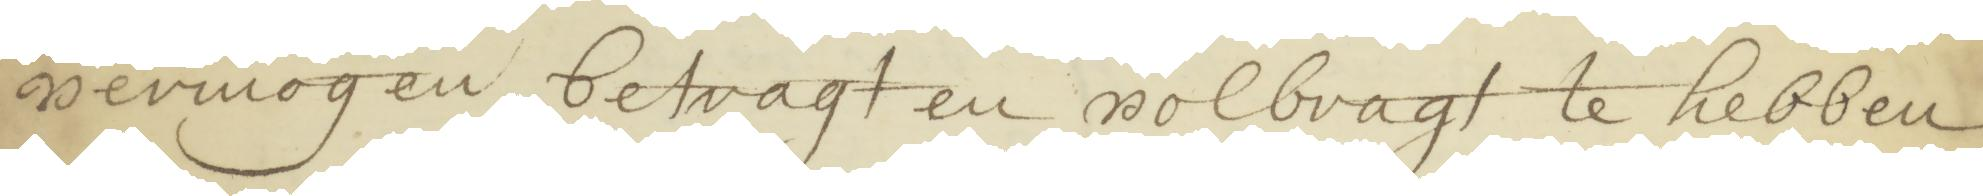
vermogen betragt en volbragt te hebben
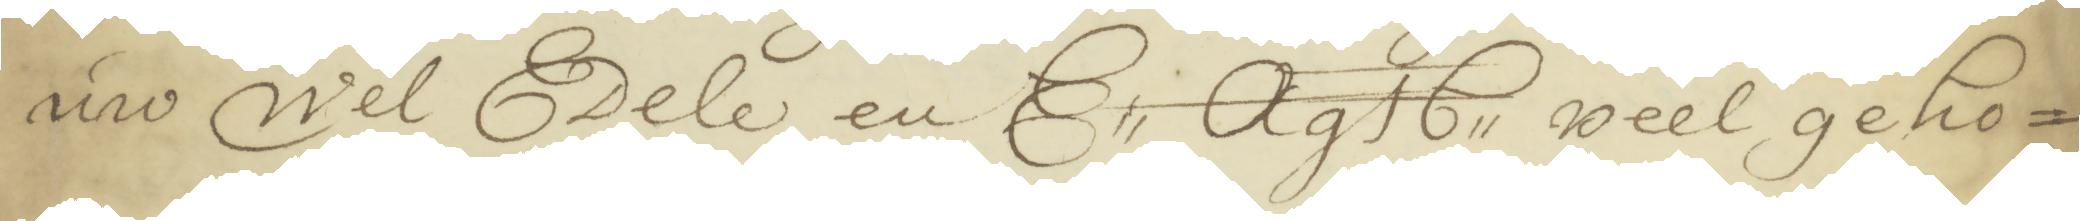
uw wel Edele en E„ Agtb„ veel geho=
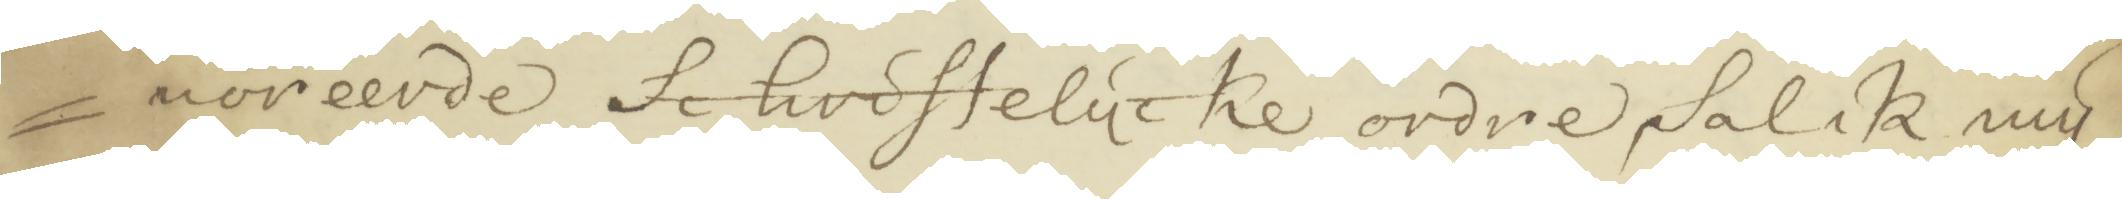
=noreerde schriftelijcke ordre, sal ik mij
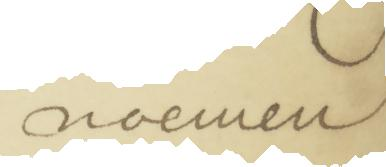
noemen
